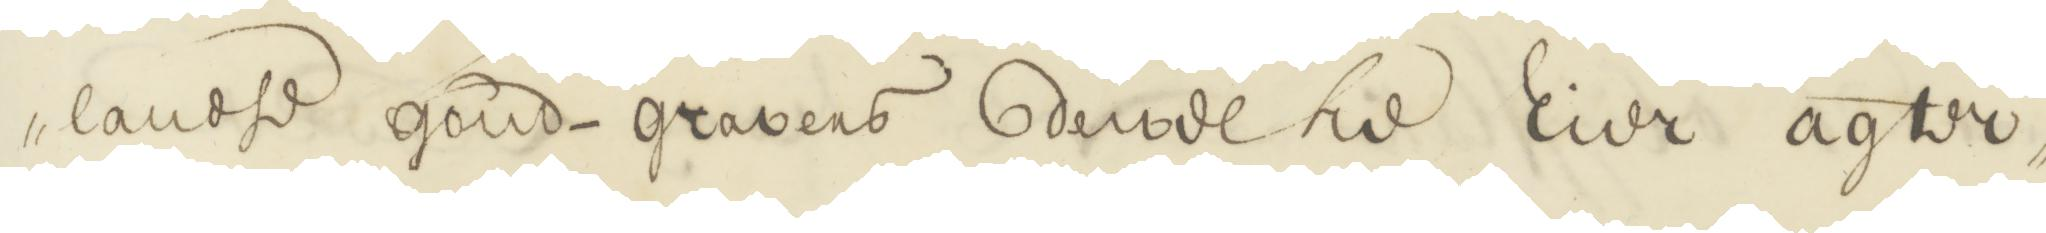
„landse goud-gravers dewelke hier agter„
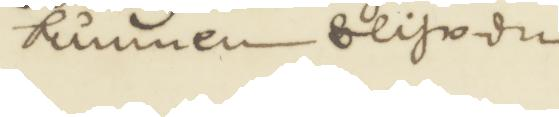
kunnen blijven
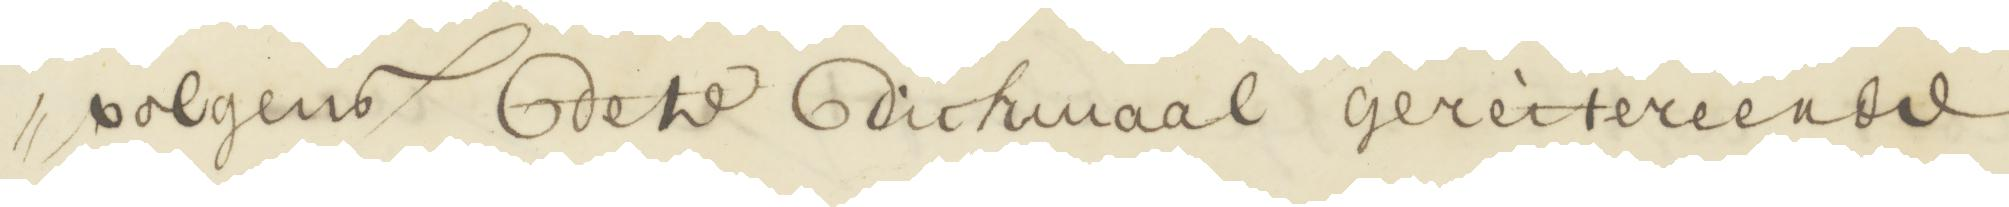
„ volgens de te dickmaal gereitereerde
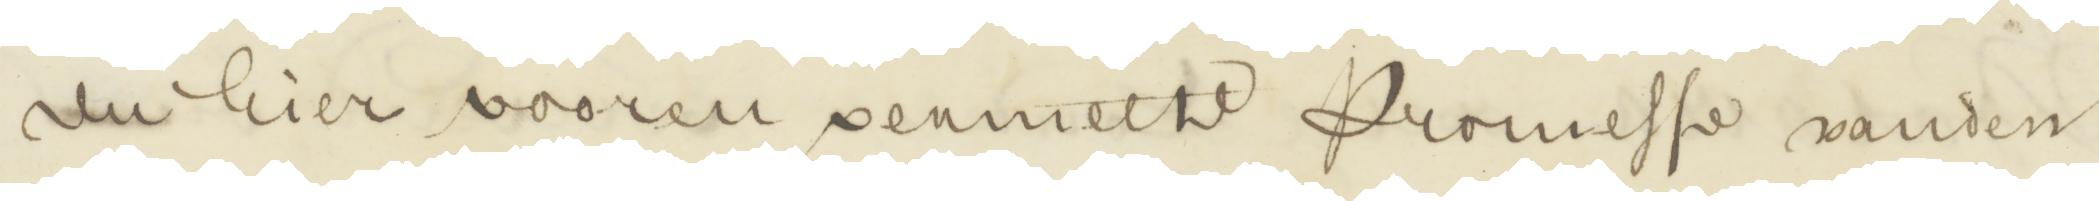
en hier vooren vermelte Promesse vanden
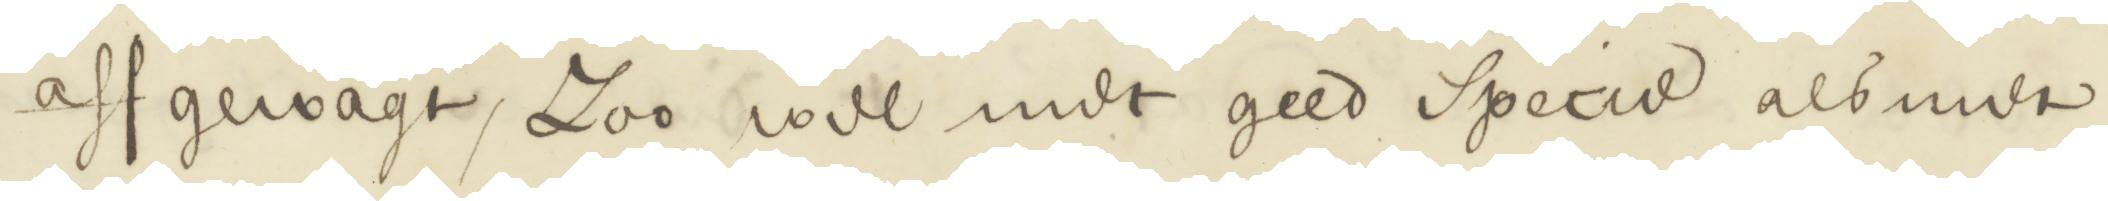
affgewagt, zoo wel met geld specie als met
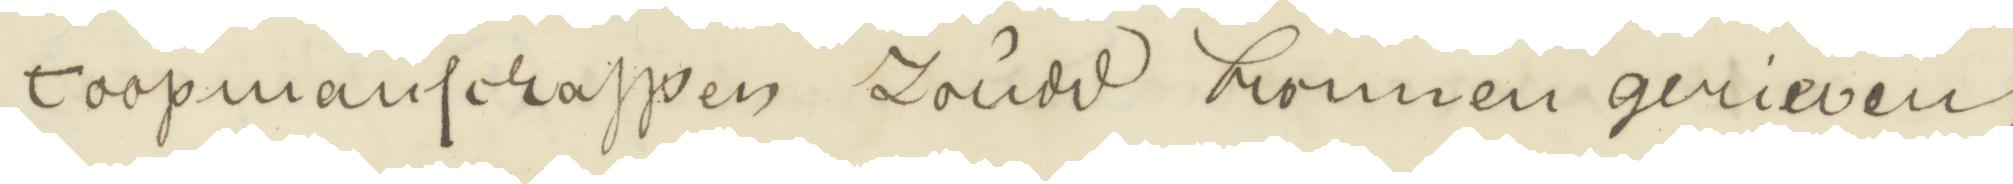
coopmanschappen zoude konnen gerieven,
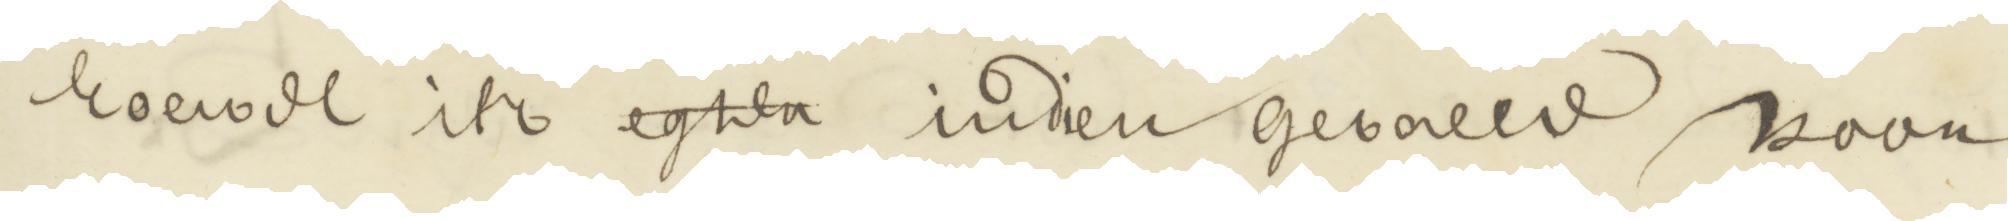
hoewel ik egter inden gevalle voor
